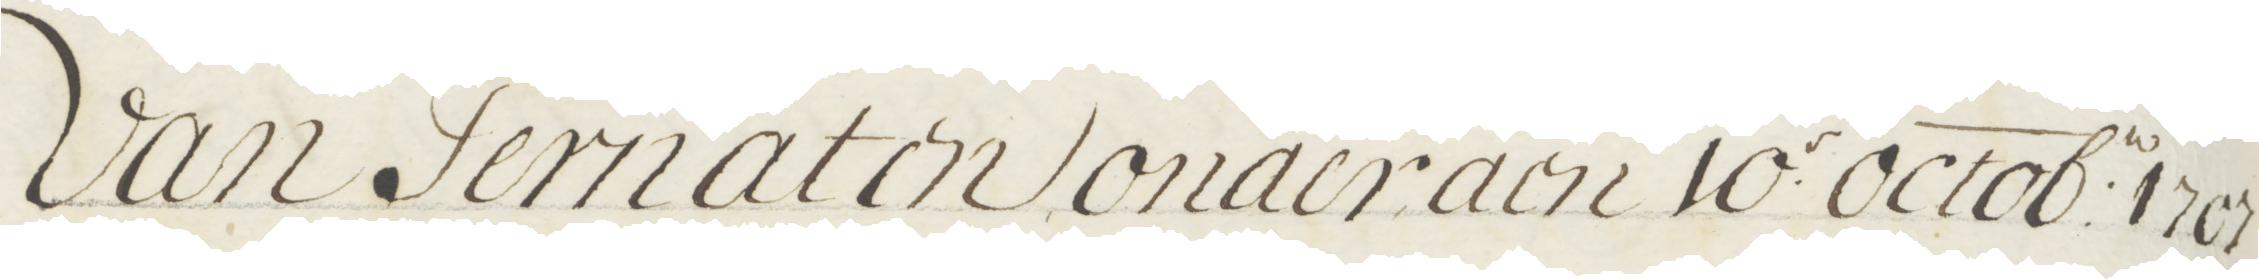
Van Ternaten onder den 10:' Octob:r 1707
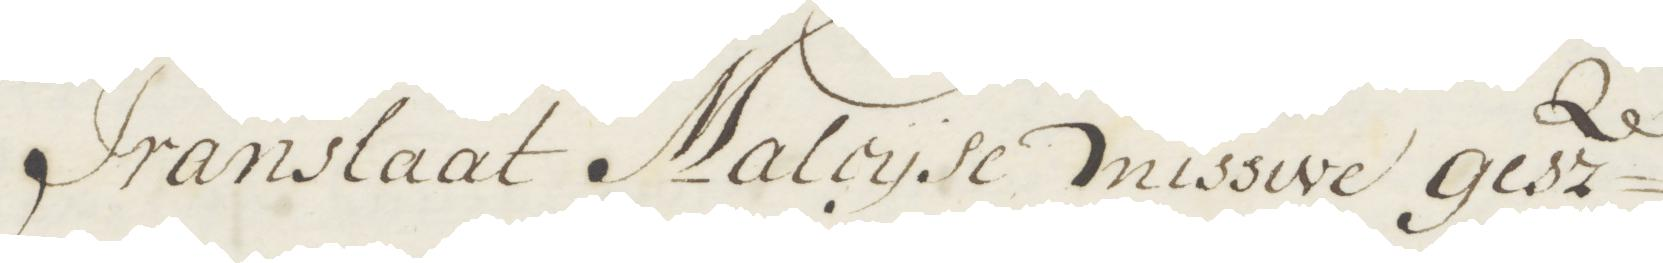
Translaat Maleijse missive gesz='
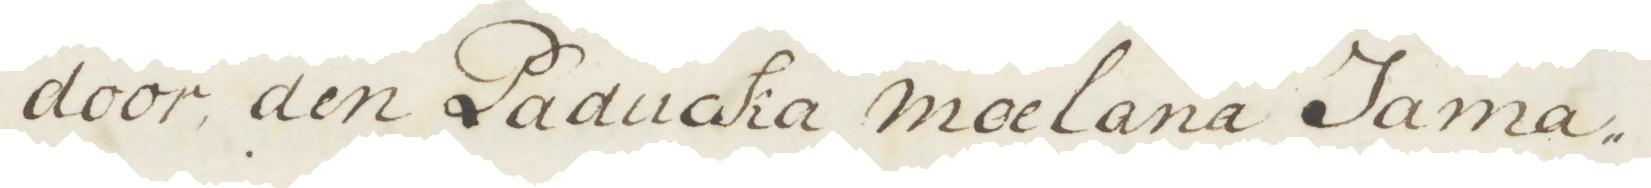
door, den Paducka moelana Iama„
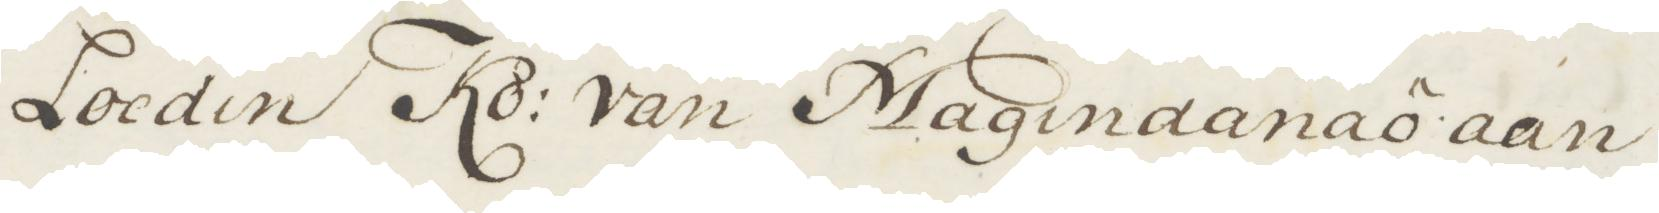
loedin Ko: van Magindanaô aan
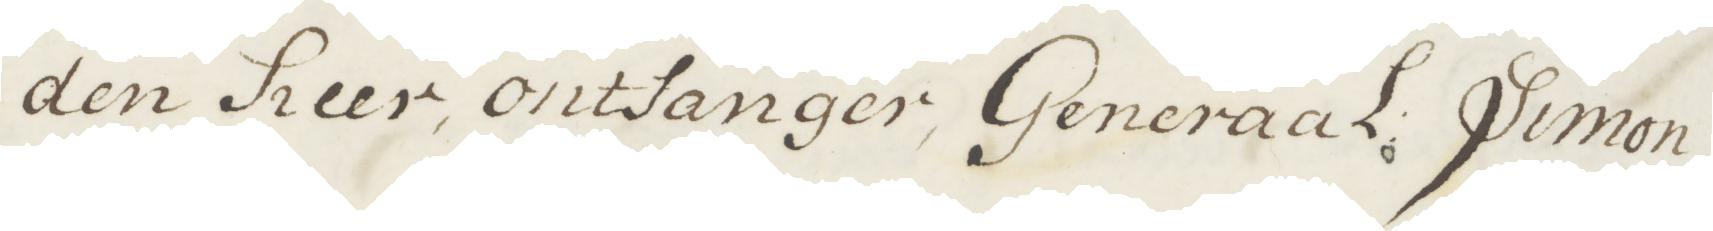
den heer, ontfanger, Generaal: Simon
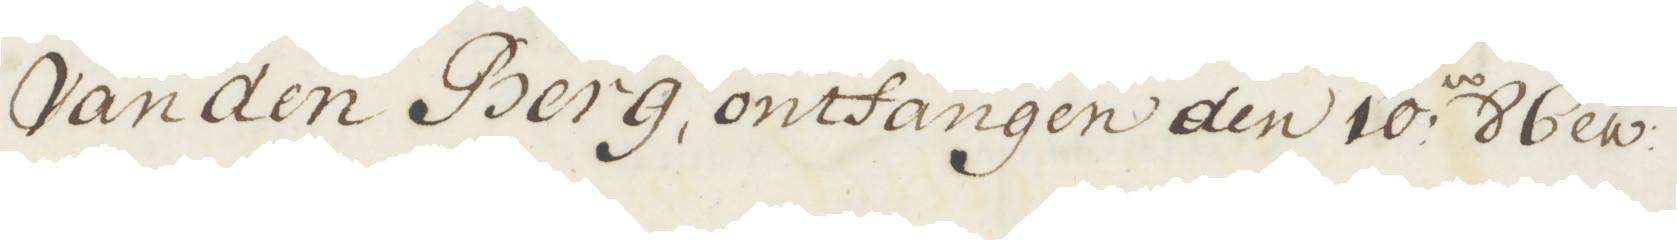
van den Berg, ontfangen den 10:en 8ber:
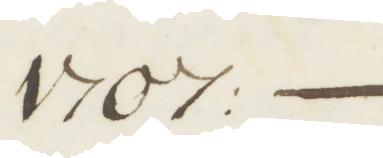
1707:—
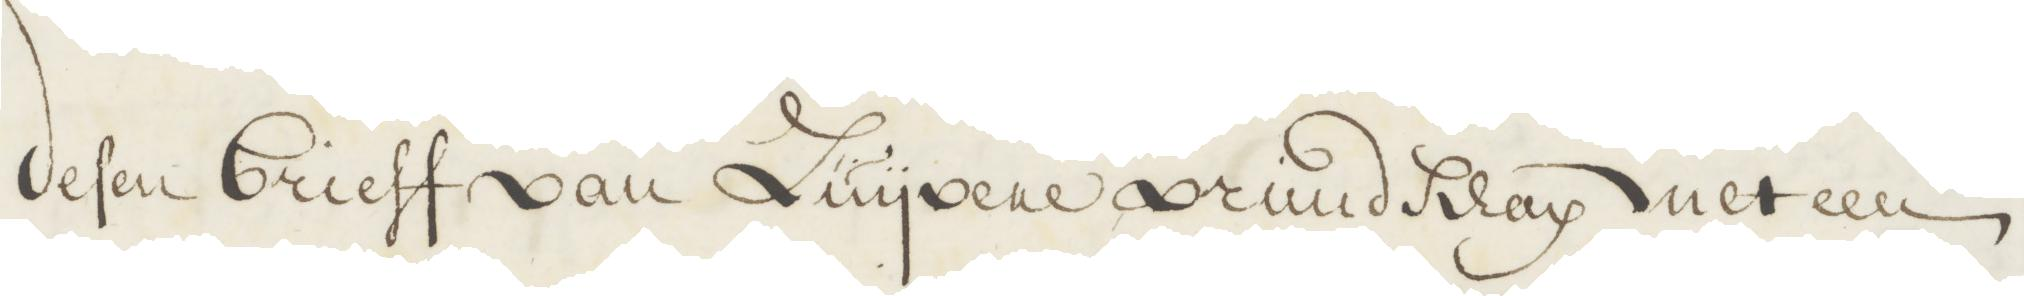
desen brieff van zuijvere vrundschap met een
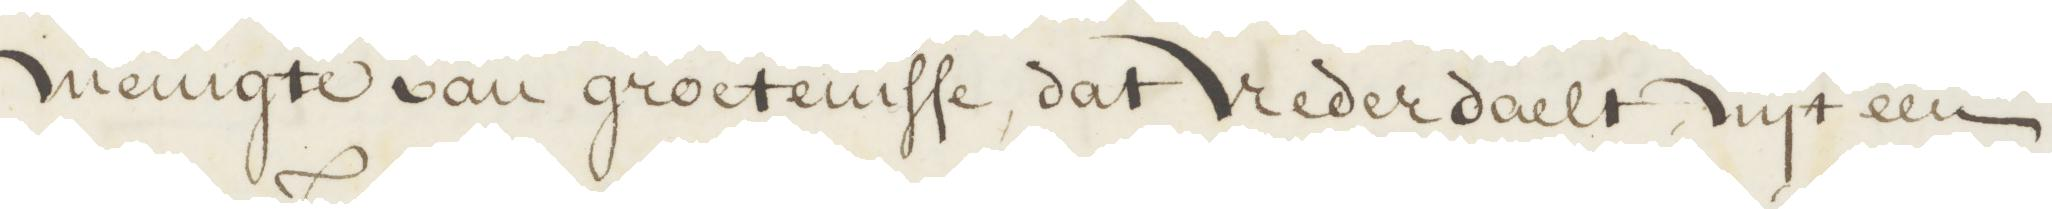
menigte van groetenisse, dat Nederdaelt, uijt een
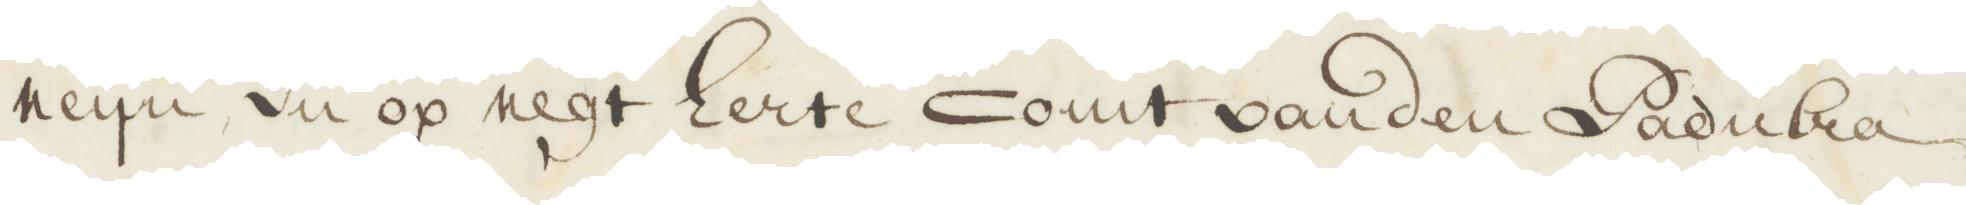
reijn, En op regt herte comt van den Paduka
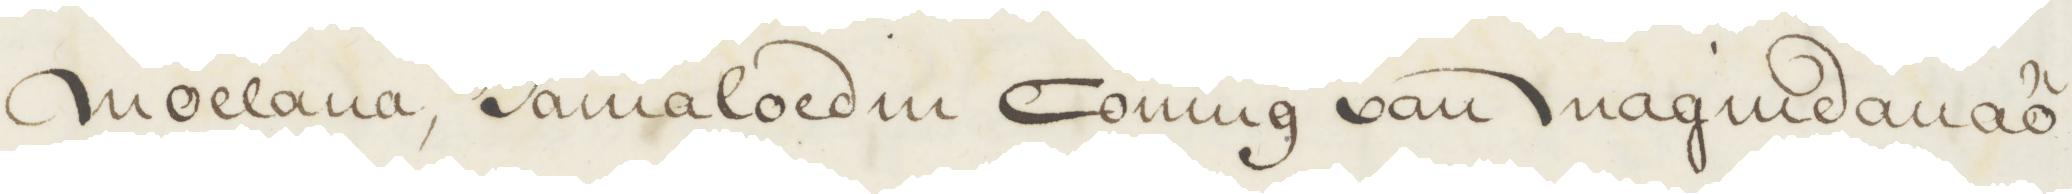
moelana, Iamaloedin Coning van magindanaô
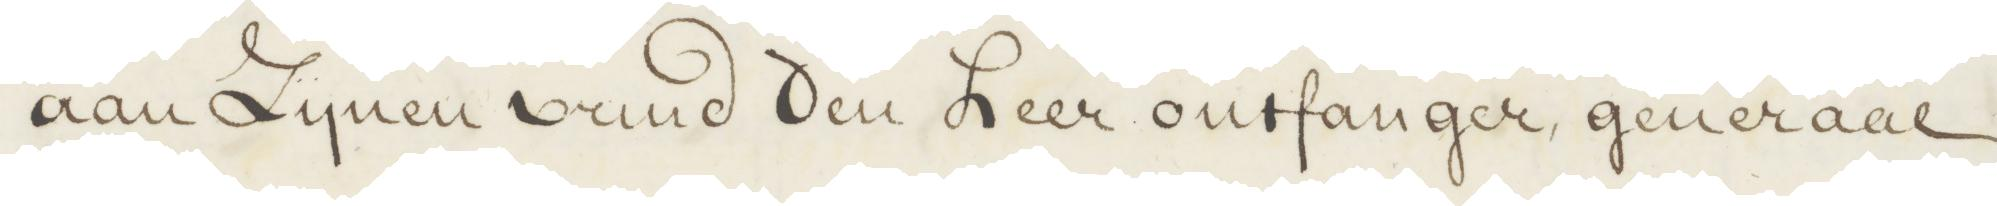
aan zijnen vrind den heer ontfanger, generaal
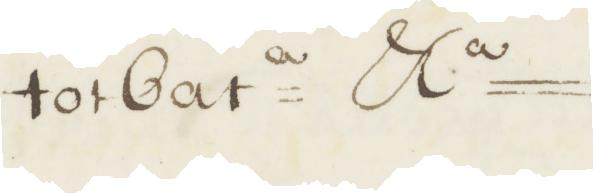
tot bat=a &=a
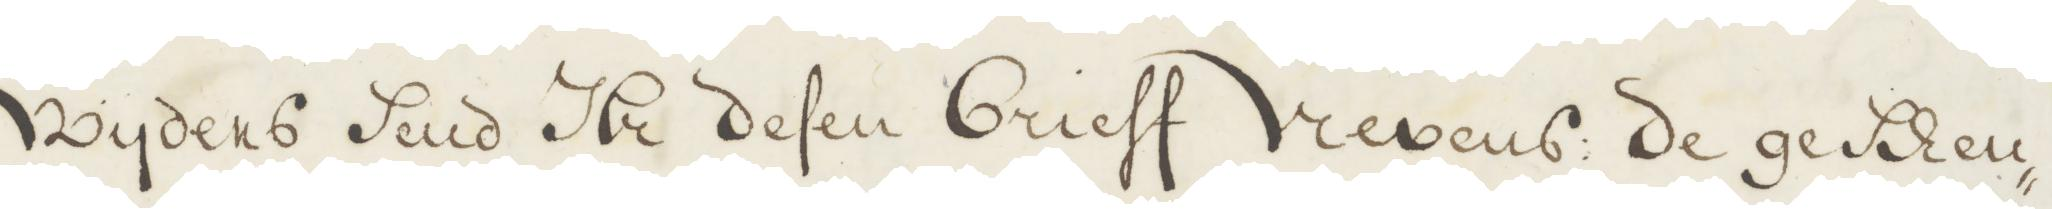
Wijders send Ik desen brieff nevens: de geschen„
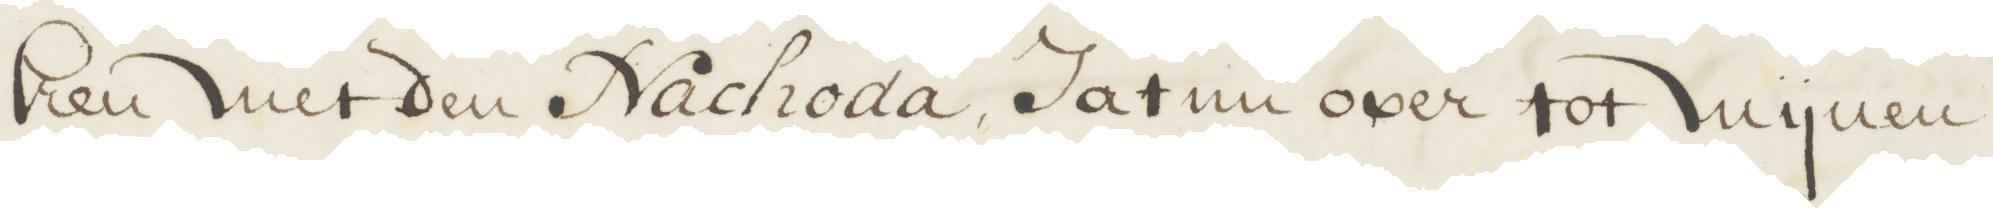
ken met den Nachoda, Iatim over tot mijnen
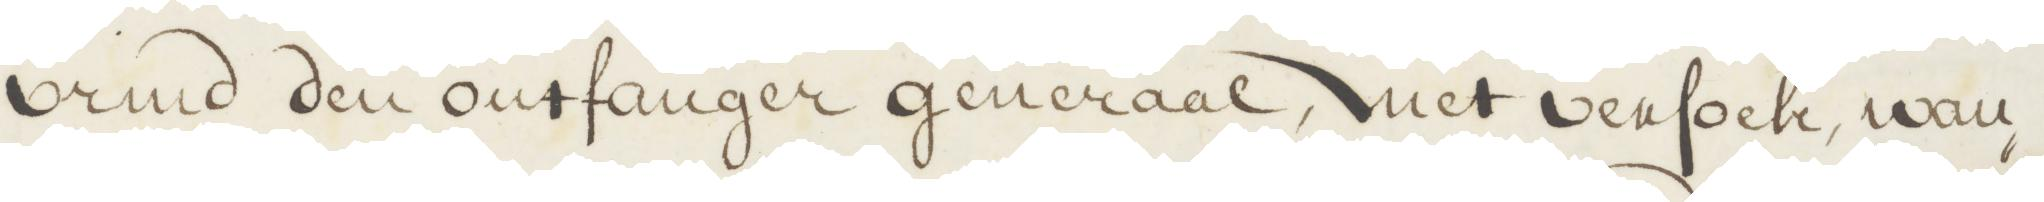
vrind den ontfanger generaal, met versoek, wan„
